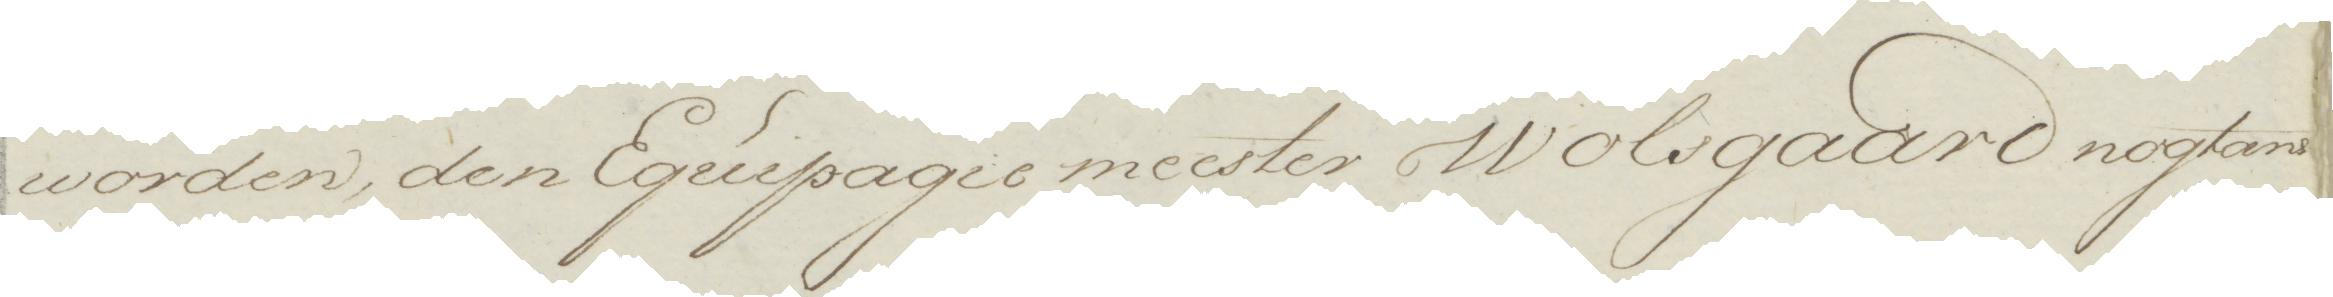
worden, den Equipagie meester Wolsgaard nogtans
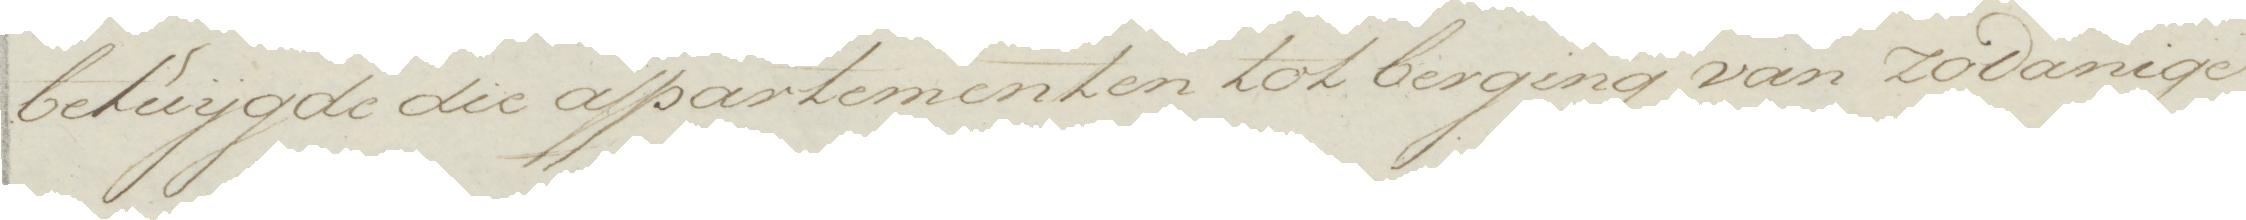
betuijgde die appartementen tot berging van zodanige
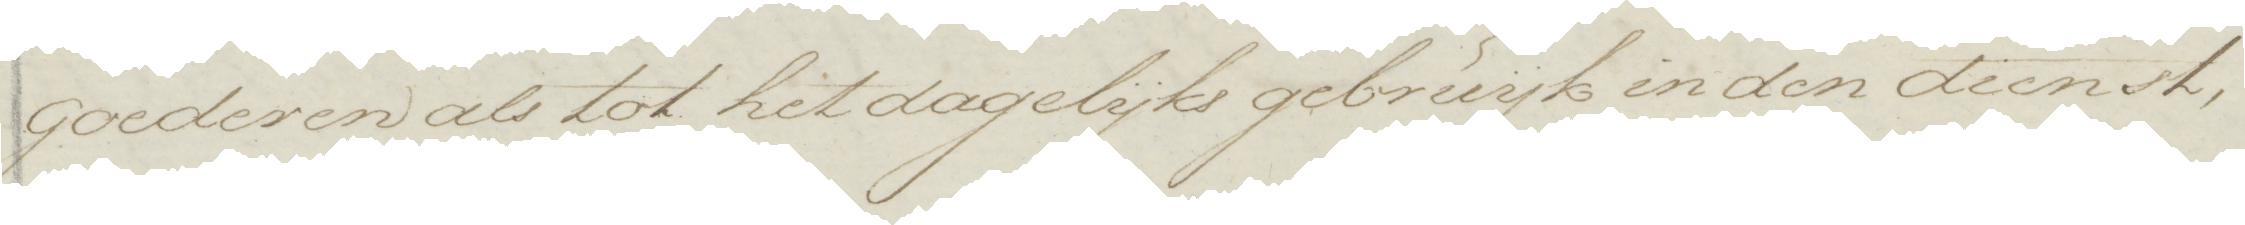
goederen als tot het dagelijks gebruijk in den dienst,
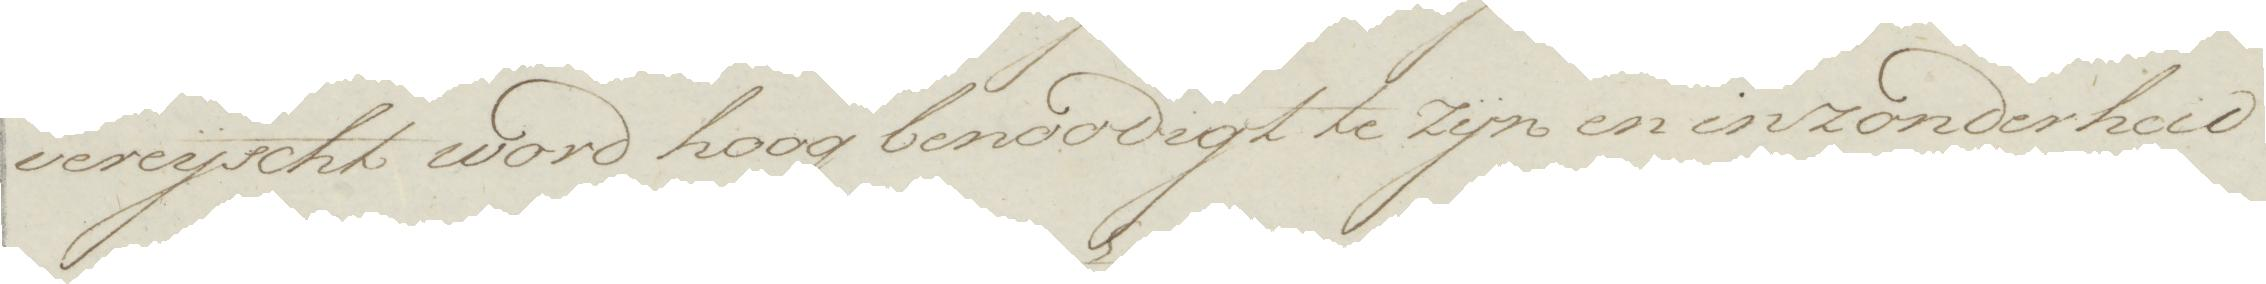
vereijscht word hoog benoodigt te zijn en inzonderheid
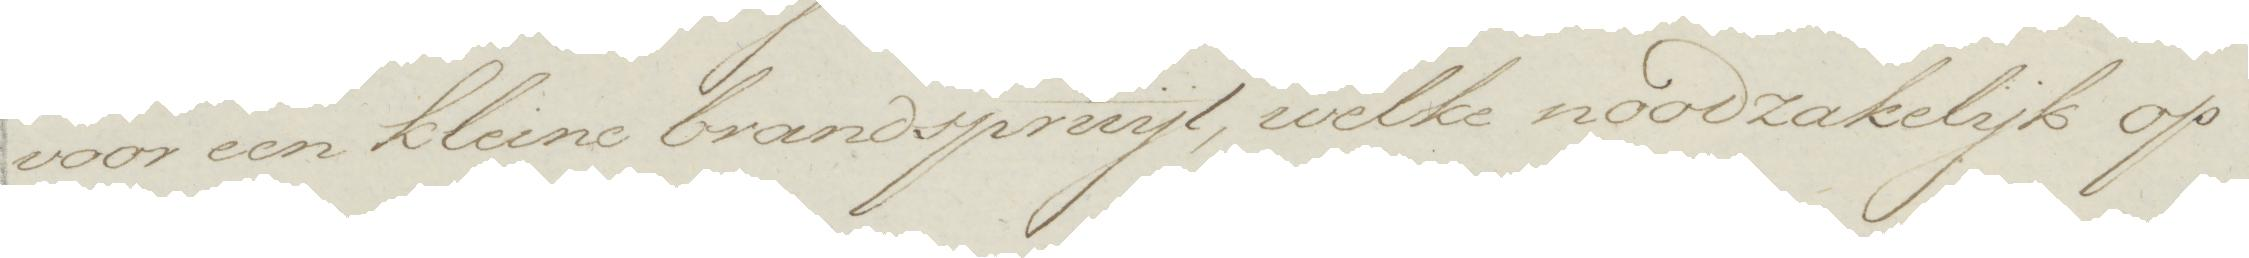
voor een kleine brandspruijt, welke noodzakelijk op
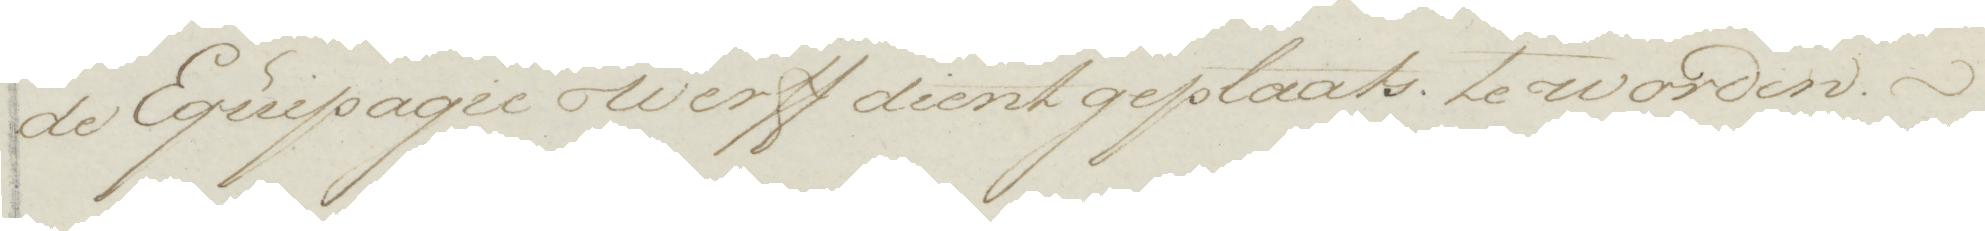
de Equipagie werff dient geplaats. te worden. —
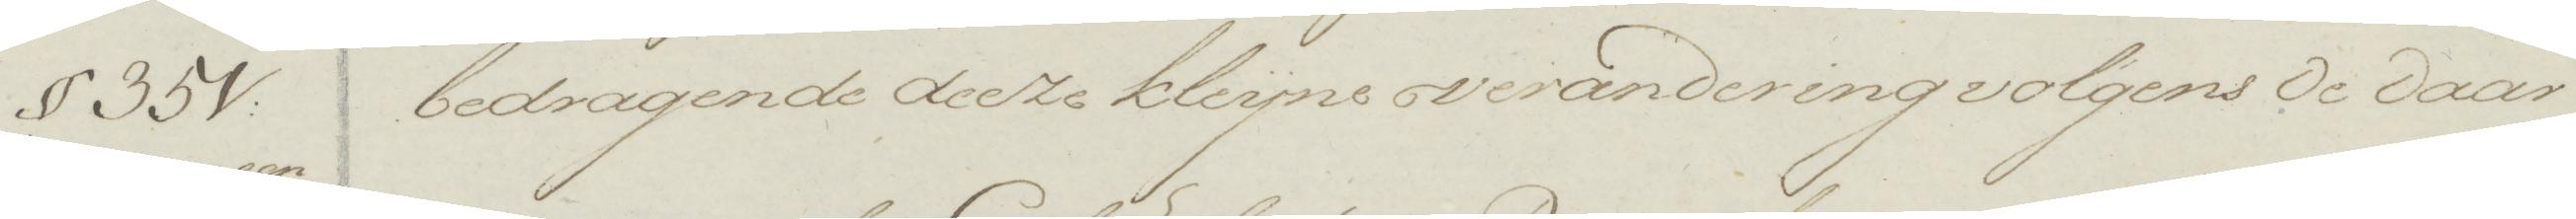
§ 351: bedragende deeze kleijne verandering volgens de daar
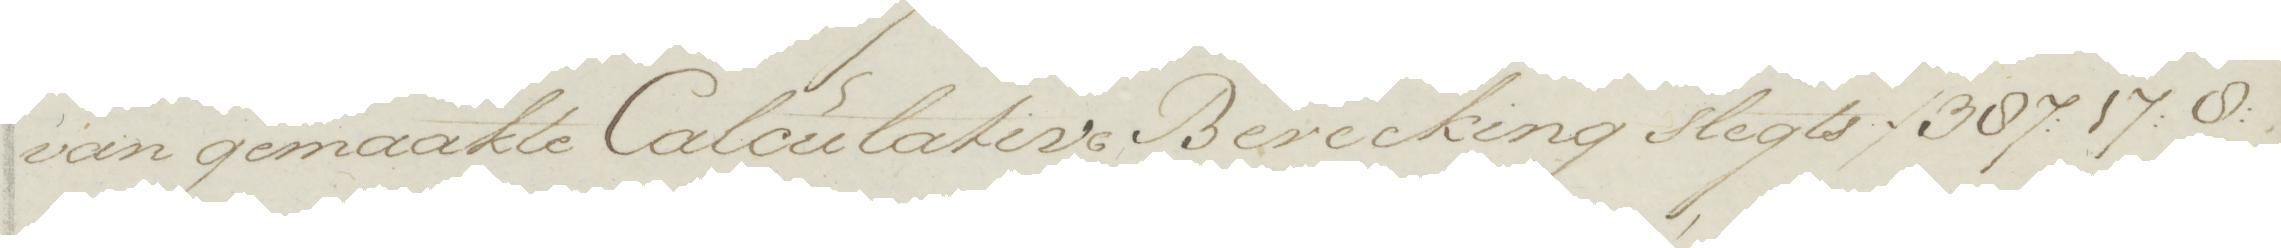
van gemaakte Calculative Bereeking slegts ƒ 387:17:8:
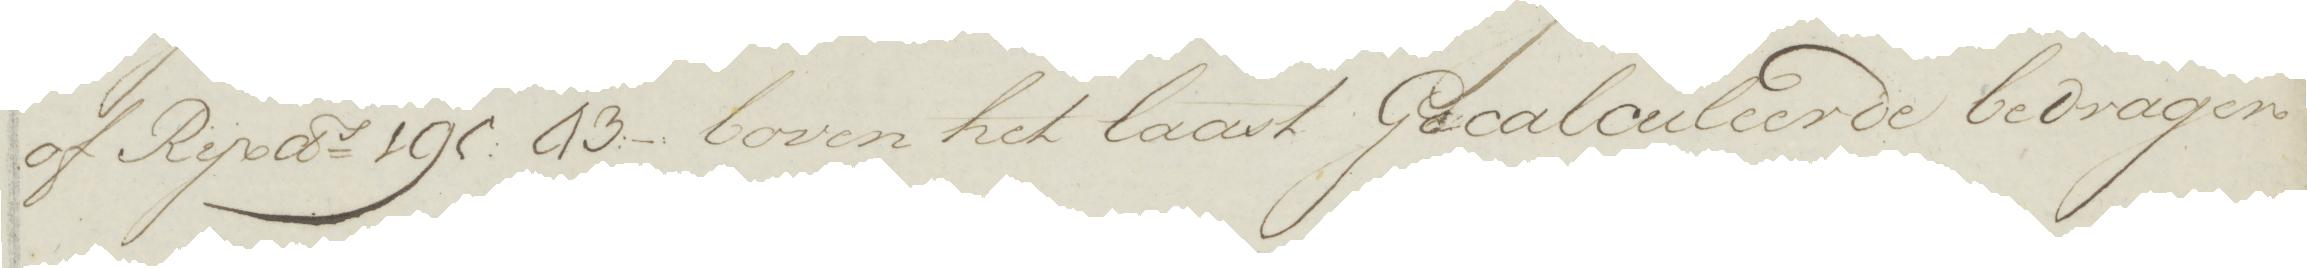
of Rijxd=s 195: 43:-: boven het laast Gecalculeerde bedragen
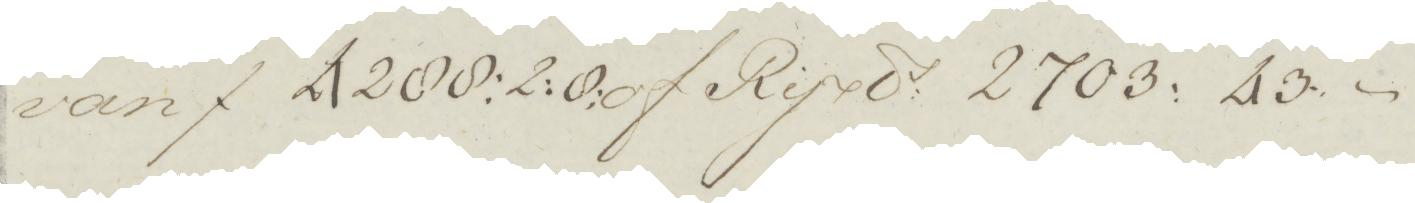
van ƒ 4288:2:8: of Rijxd:s 2703: 43: —
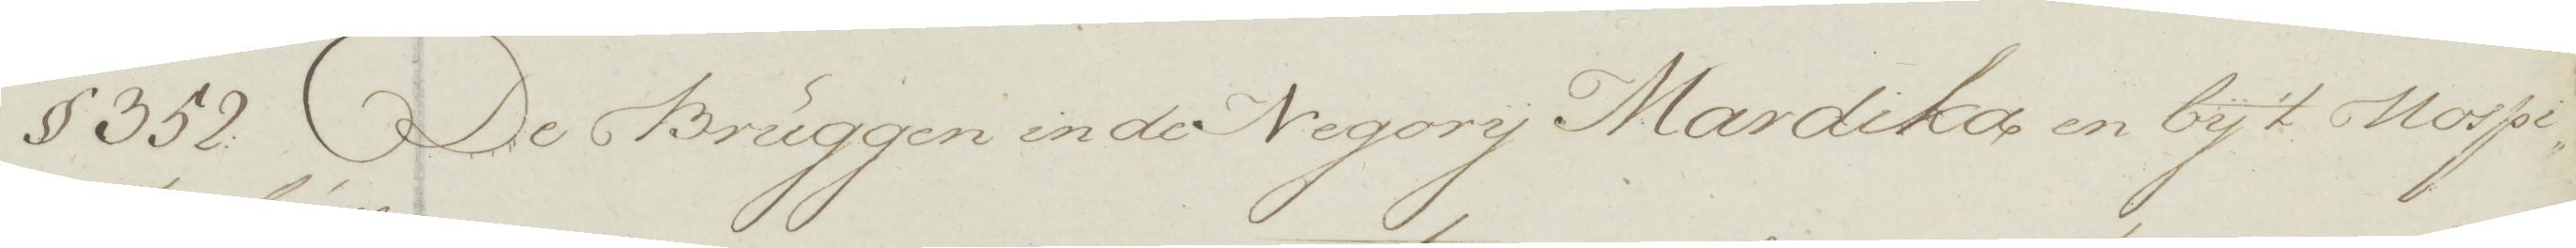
§352: De Bruggen in de Negorij Mardika en bij't Hospi„
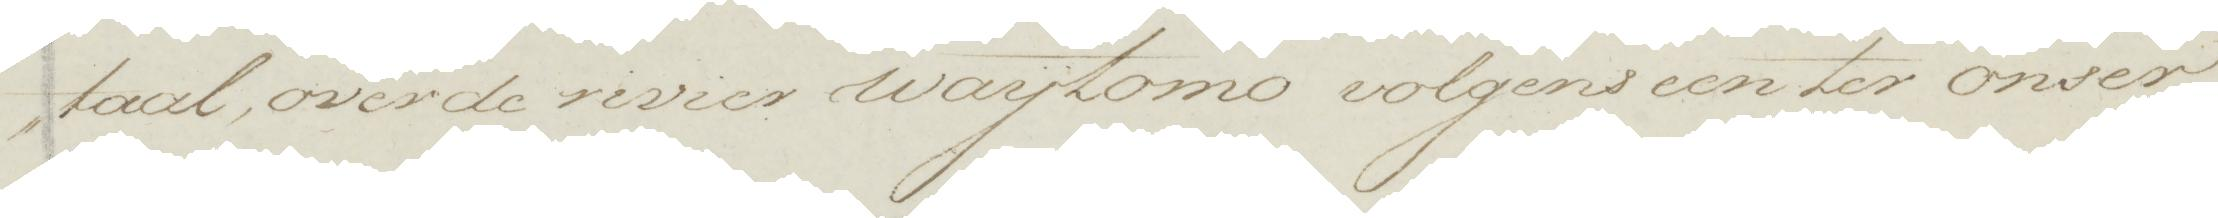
„taal, over de rivier waijtomo volgens een ter onser
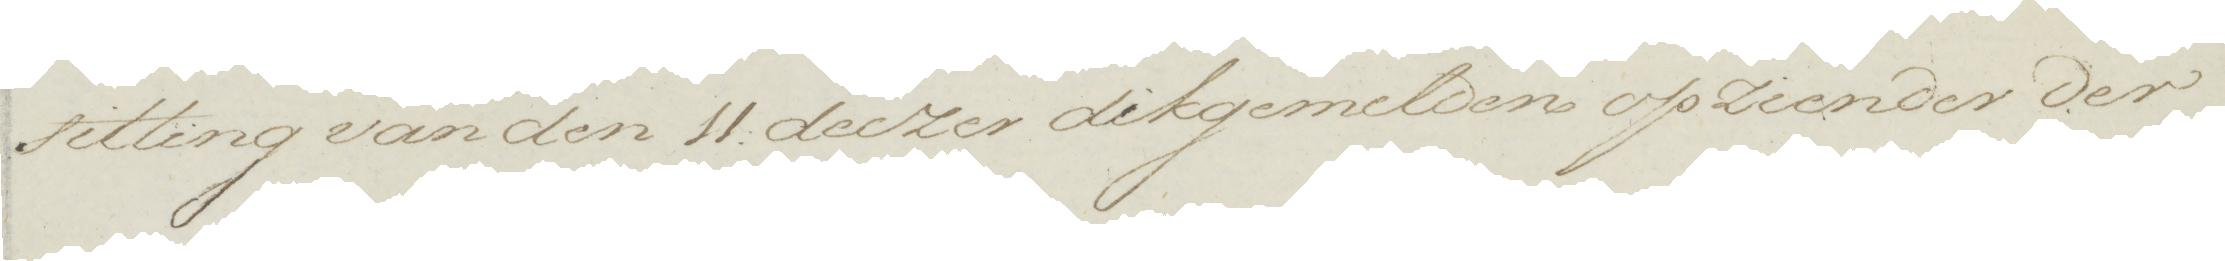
sitting van den 11: deezer dikgemelden opziender der
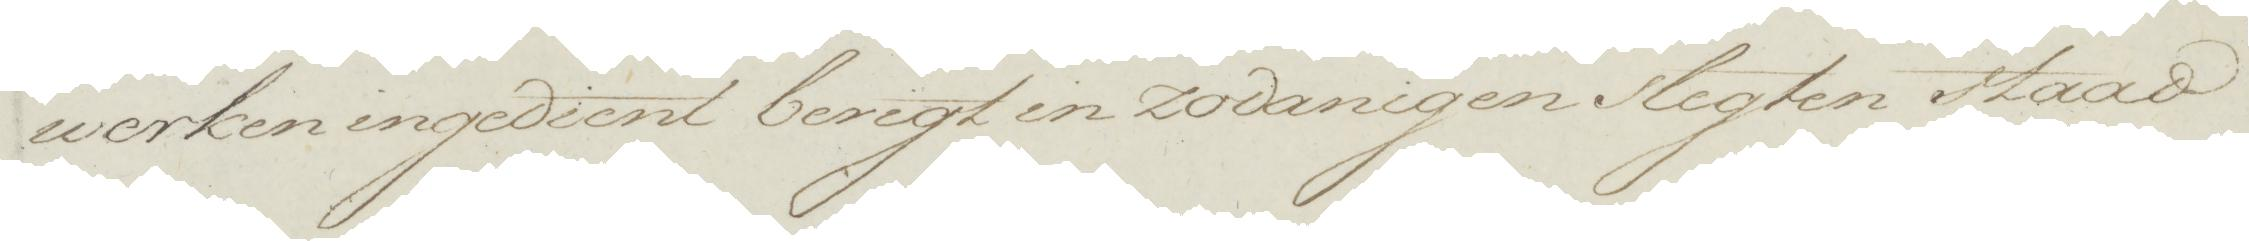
werken ingedient berigt in zodanigen slegten staad
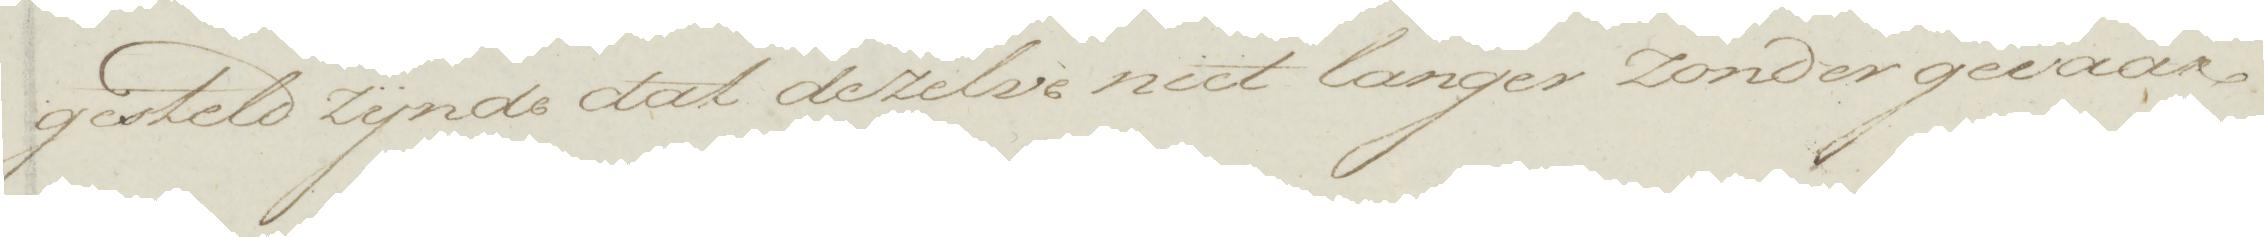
gesteld zijnde dat dezelve niet langer zonder gevaar
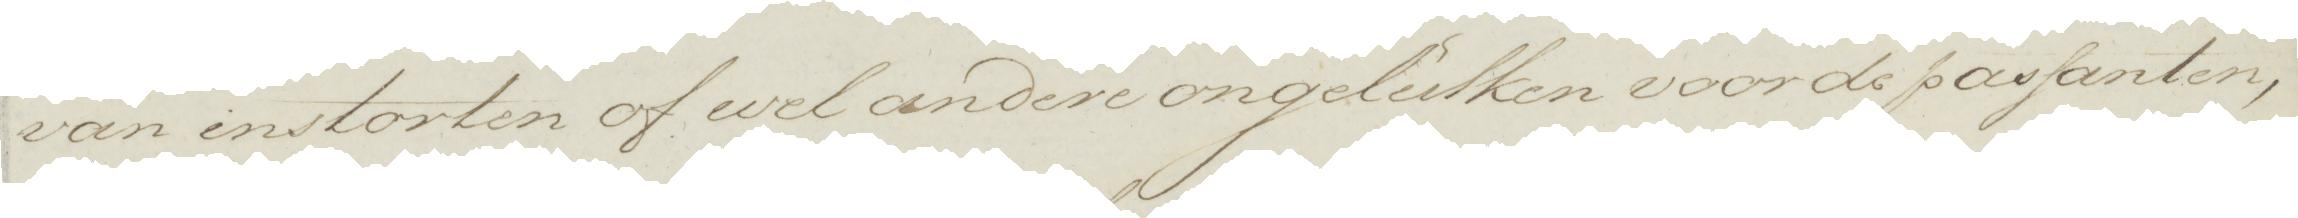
van instorten of wel andere ongelukken voor de passanten,
